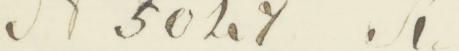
N 5047 R.
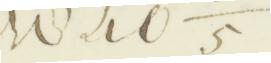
1840 3/5
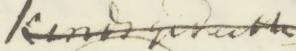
kindsgedeelte
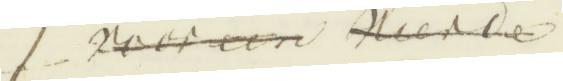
voor een vierde
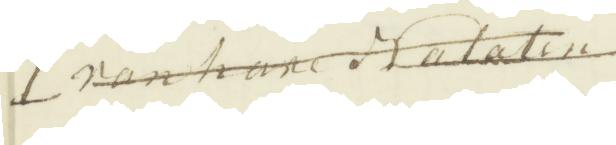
van hare Nalaten
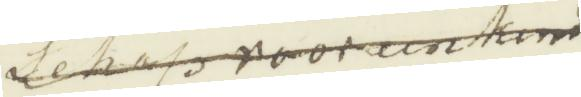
schap voor een kinds
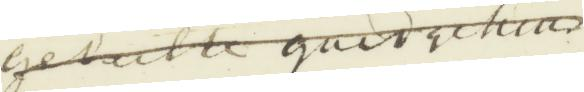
gedeelte goedgekeur
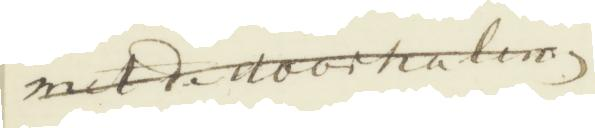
met de doorhaling
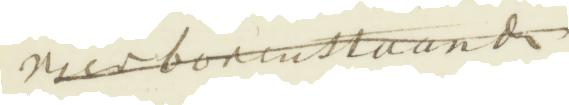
vier bovenstaande
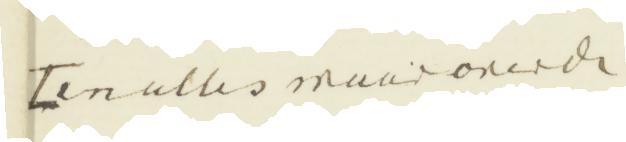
¶ en alles waar over de
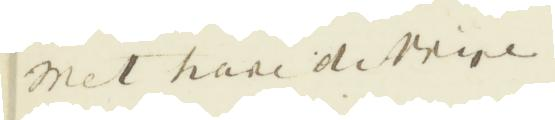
met hare de vrije
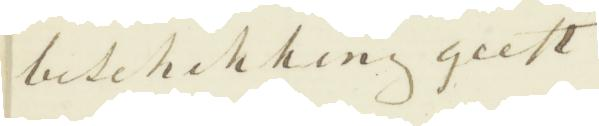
beschikking geeft
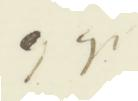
q q
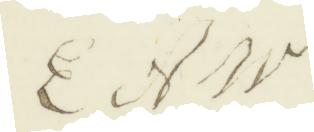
ENW
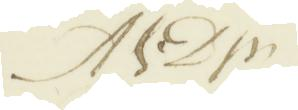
AvD j=r
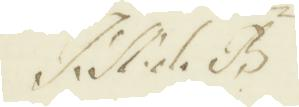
J:A: d. B
